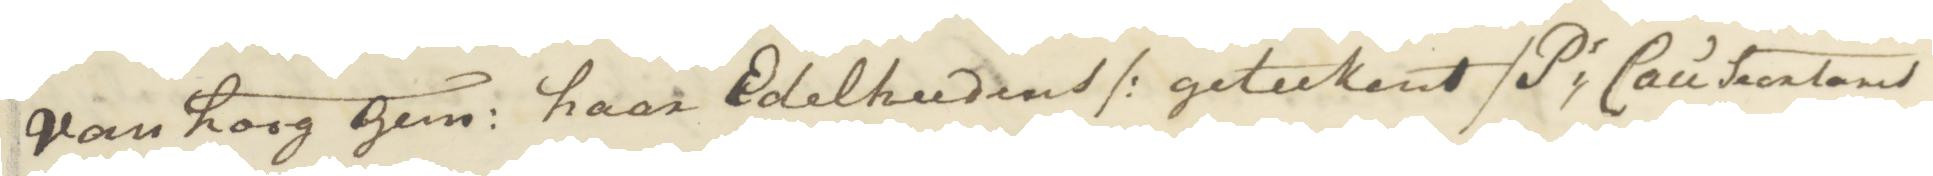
van hoog gem: haar Edelheedens /:geteekent/ P„r Cau secetaris
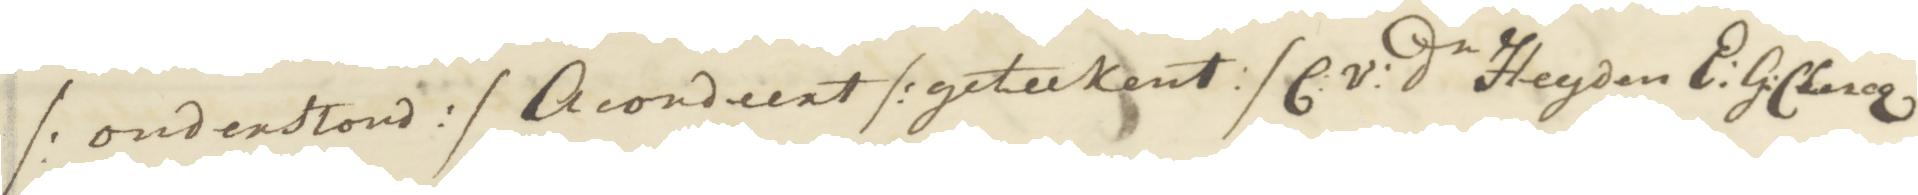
/:onderstond:/ Acordeert /:geteekent:/ C: v: dr Heyden E: G: Clercq
